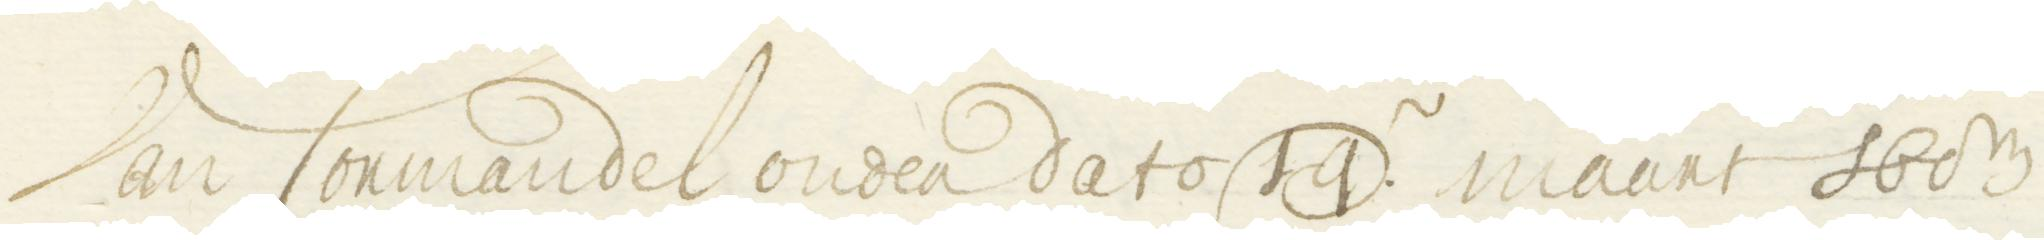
Van Cormandel onder dato 14:' maart 1683
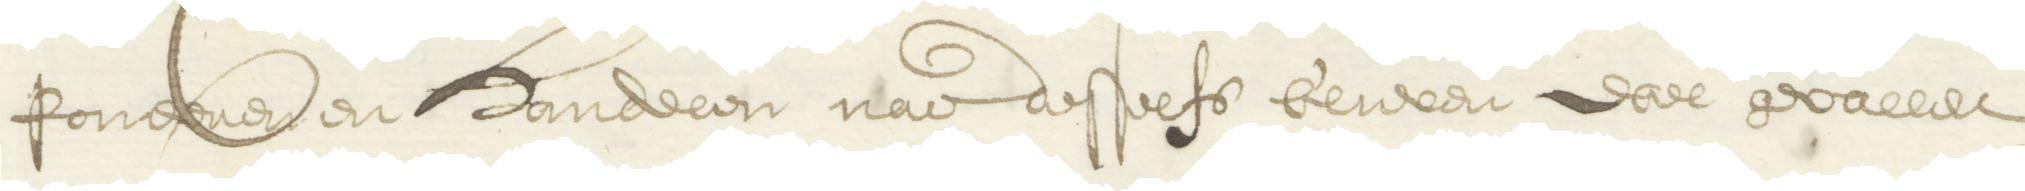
poneeren en Handelen nae desselfs blieven wel gevallen
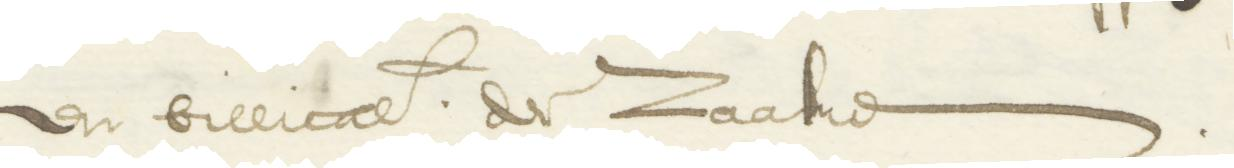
en billical: de Zaake
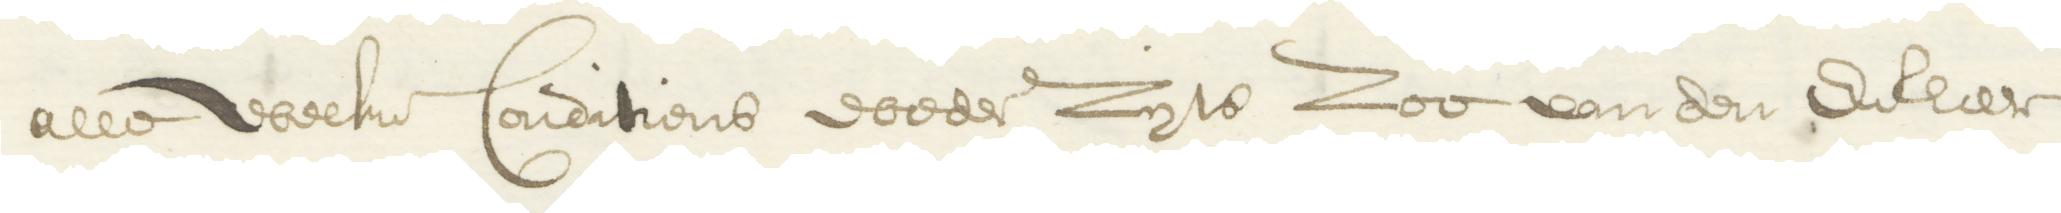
alle welke Conditiens weder Zyts Zoo van den E E heer
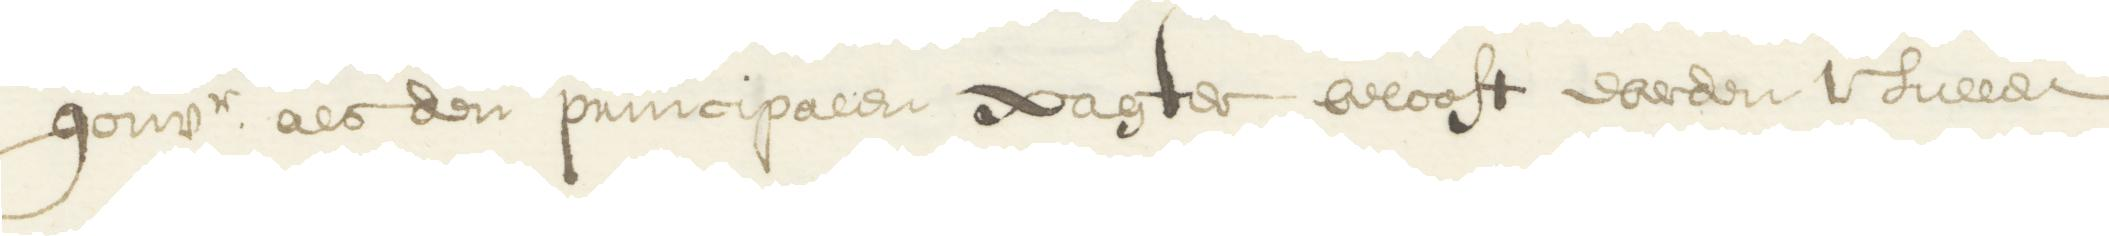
gouv:r als den principalen pagter belooft werden te sullen
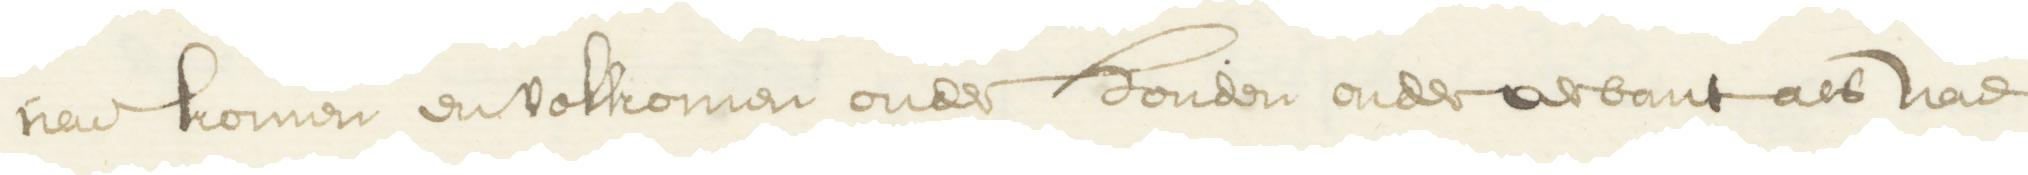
naekomen en volkomen onder Houden onder verbant als nae
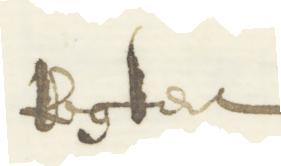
Regten
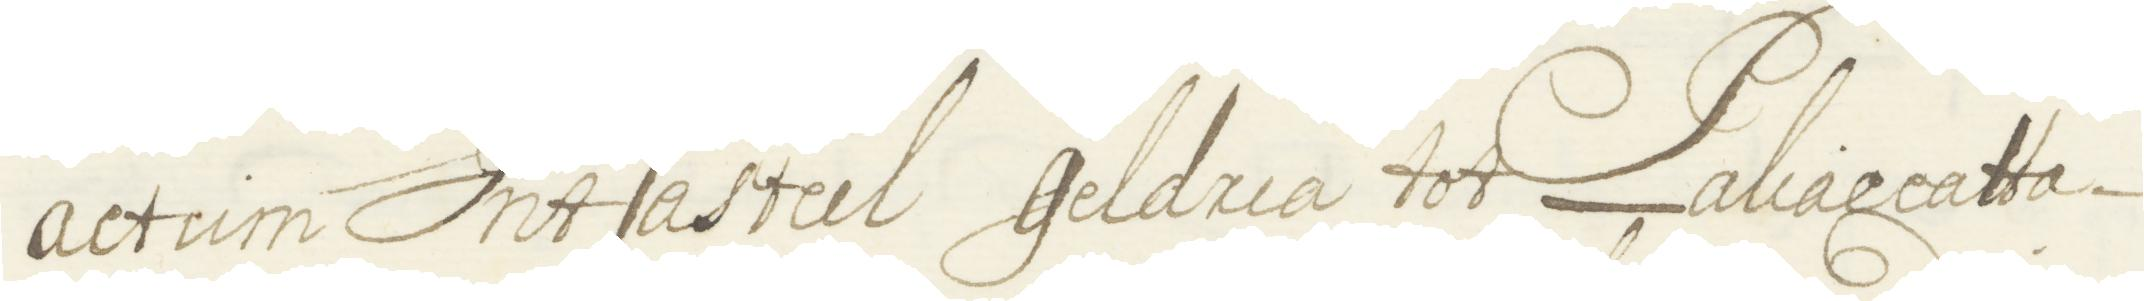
actum Int Casteel geldria tot Paliaccatta
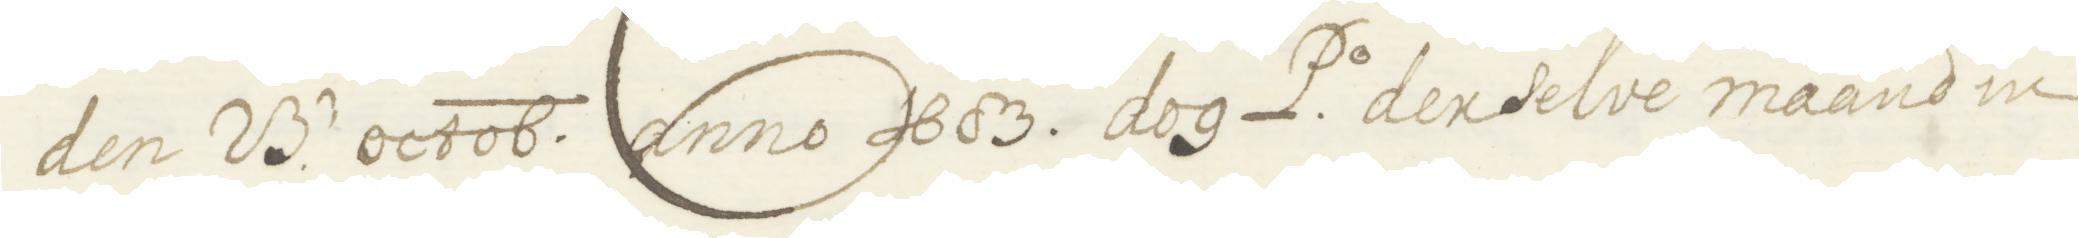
den 23:' octob. anno 1683, dog P.o derselve maand in
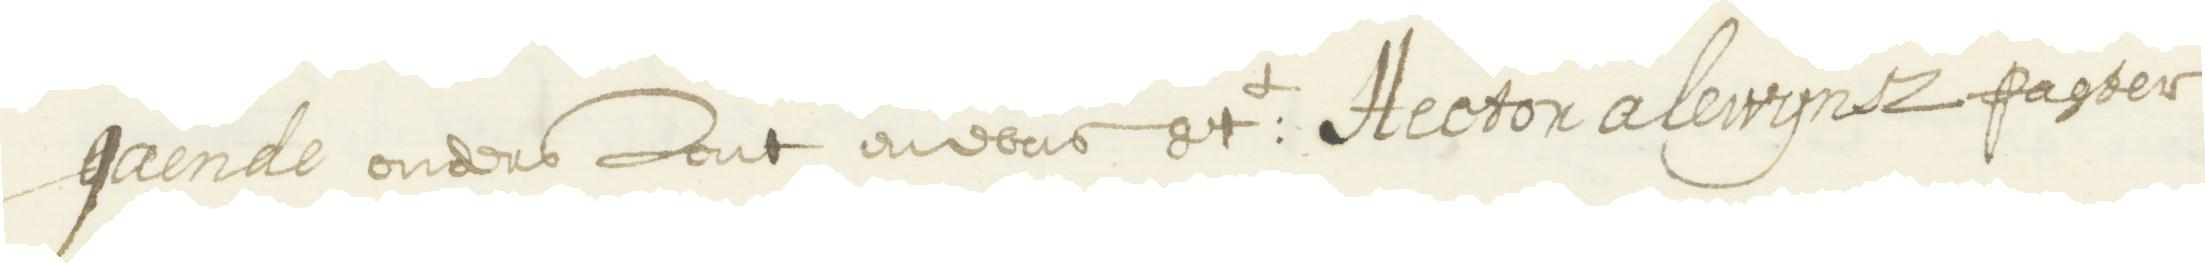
gaende onderstont en was get:t Hector alewijnsz pagter
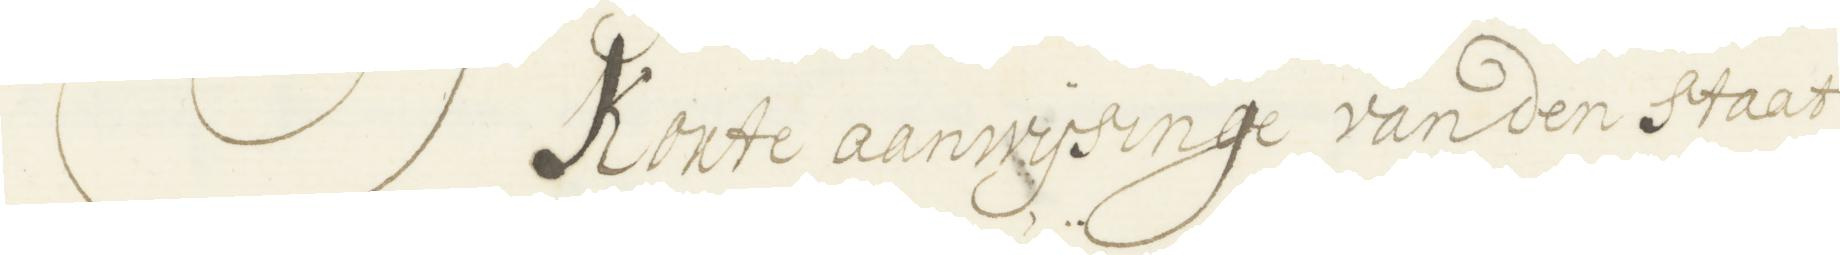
Korte aanwijsinge van den staat
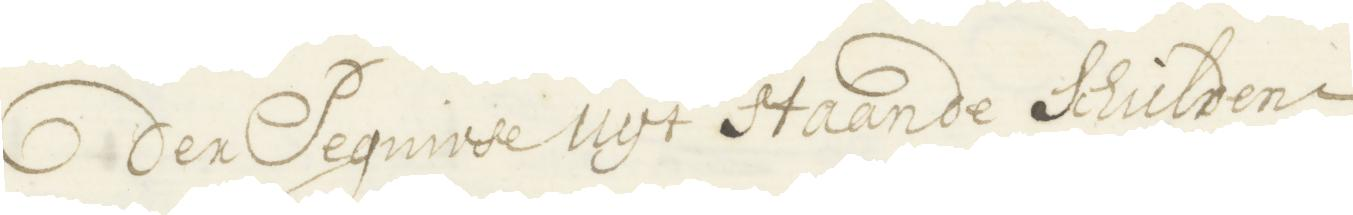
der Peguiese uijt staande Schulden
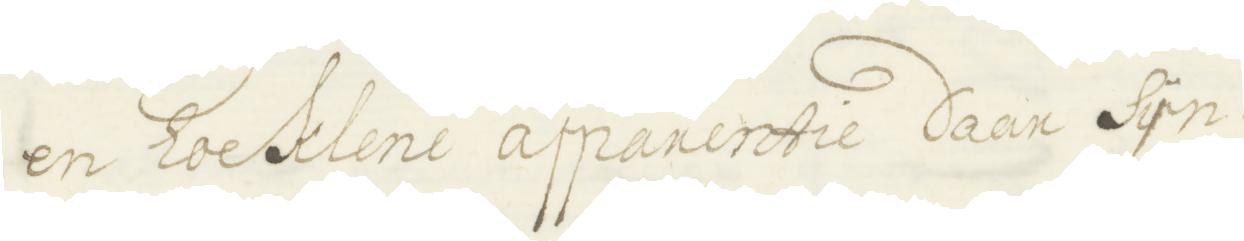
en hoe klene apparentie daar Sijn
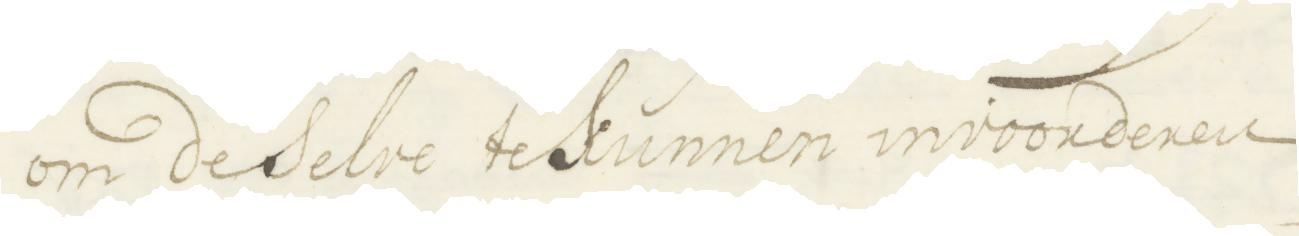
om deselve te kunnen invoorderen
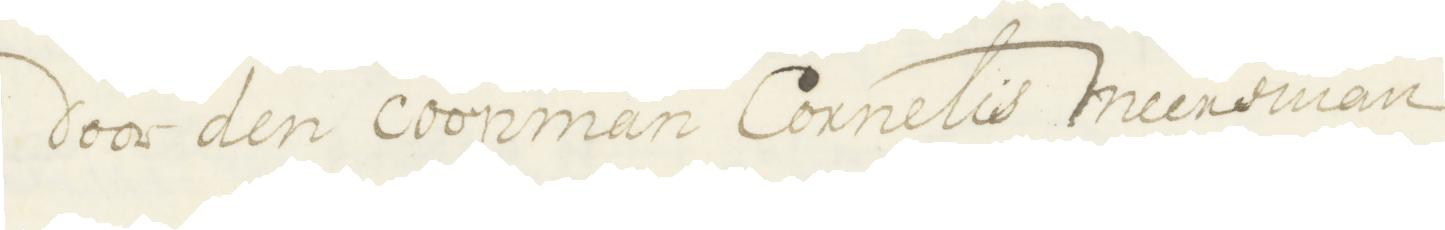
door den coopman Cornelis Meersman
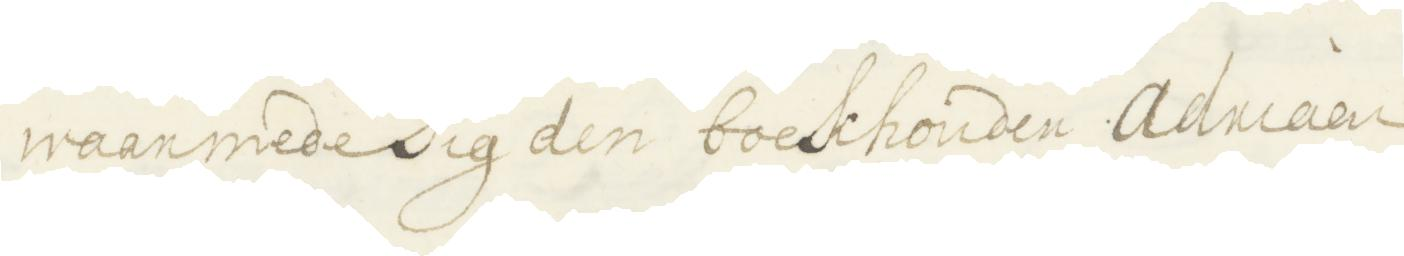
waarmede Sig den boekhouder Adriaen
